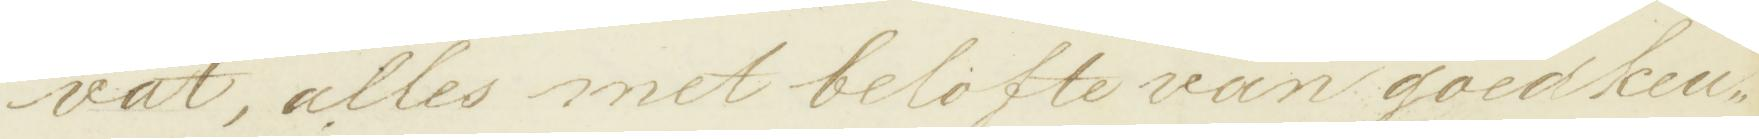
vat, alles met belofte van goedkeu„
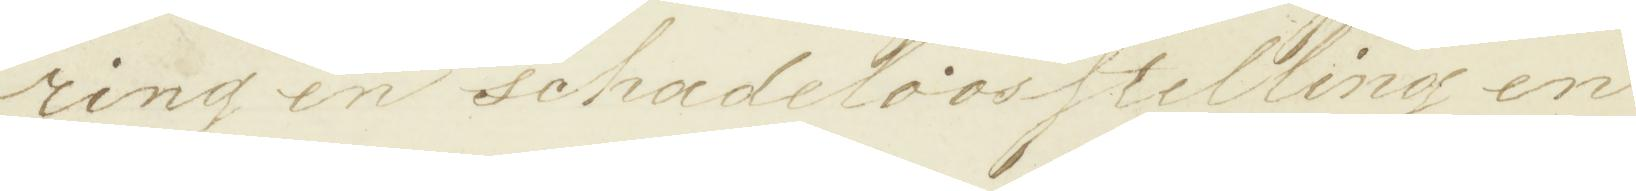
ring en schadeloosstelling en
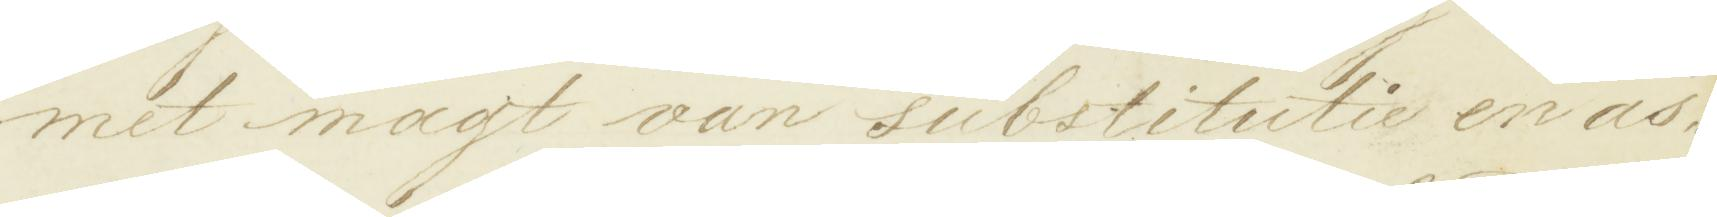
met magt van substitutie en as„
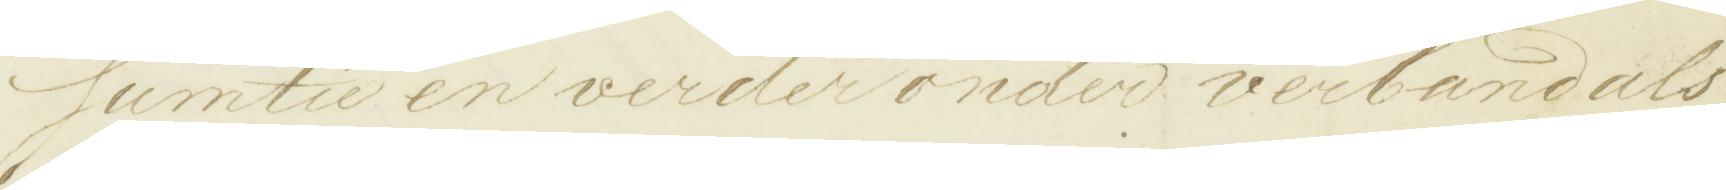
sumtie en verder onder verband als
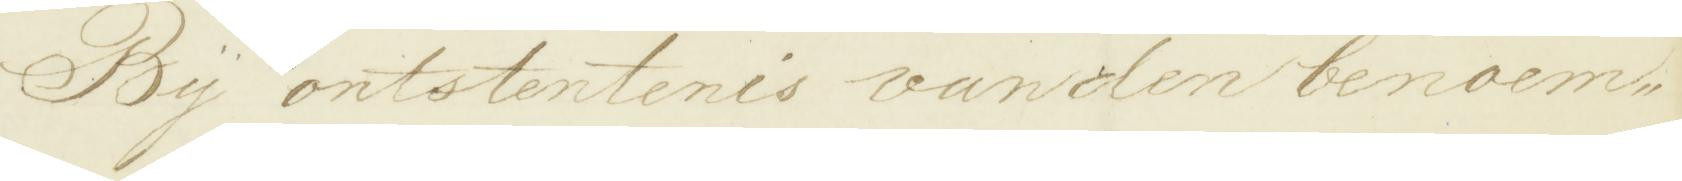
Bij ontstentenis van den benoem„
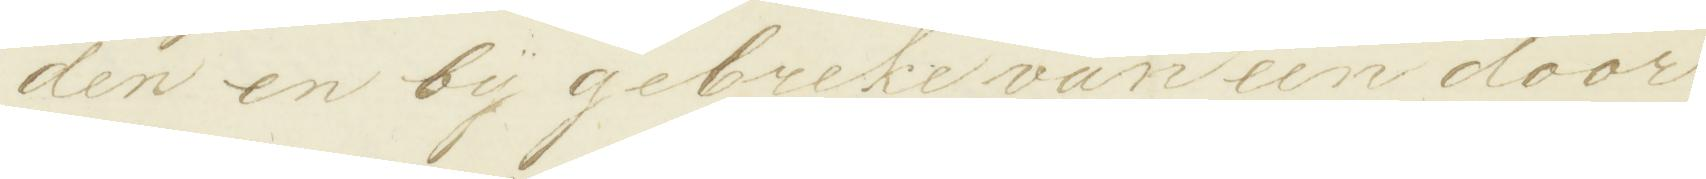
den en bij gebreke van een door
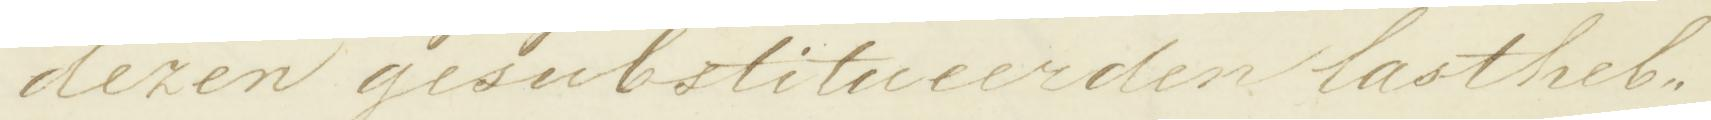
dezen gesubstitueerden last heb„
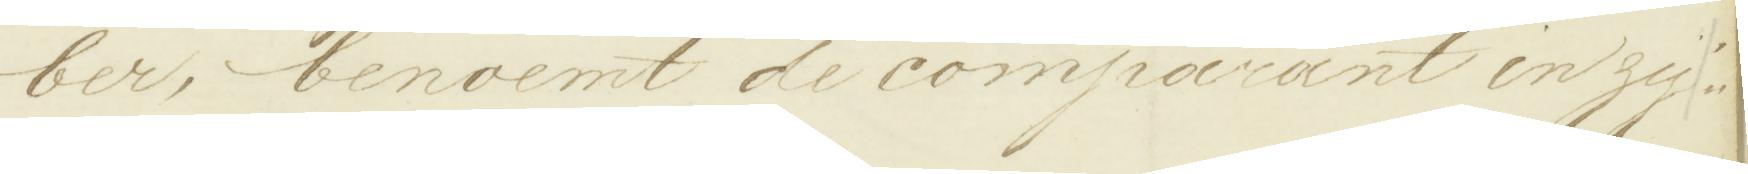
ber, benoemt de comparant in zij„
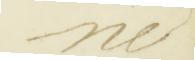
ne
